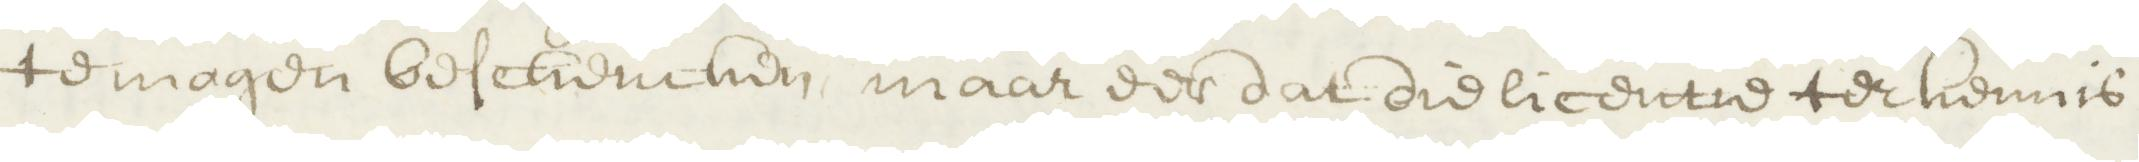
te mogen beschencken, maar eer dat die licentie ter kennis
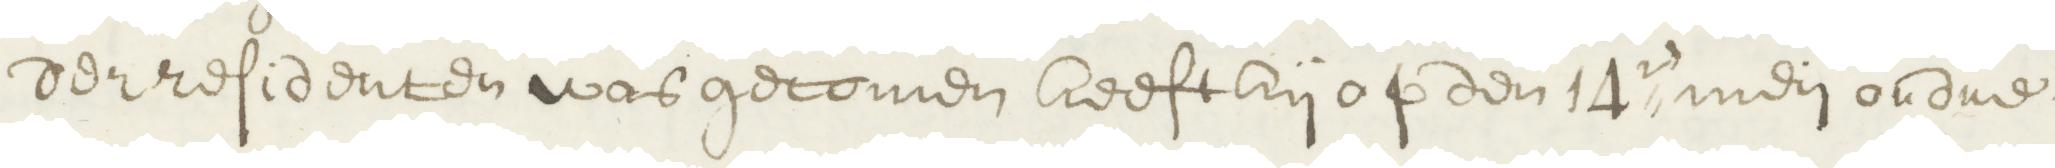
der residenten was gecomen heeft hij op den 14„e meij ordre
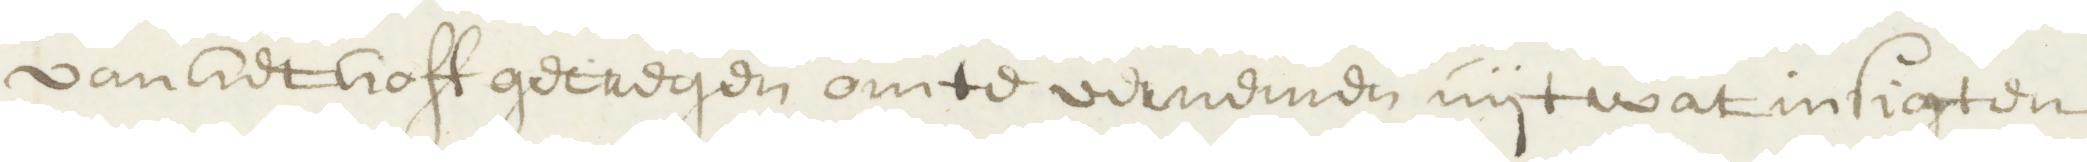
van het hoff gecregen om te vernemen uijt wat insigten
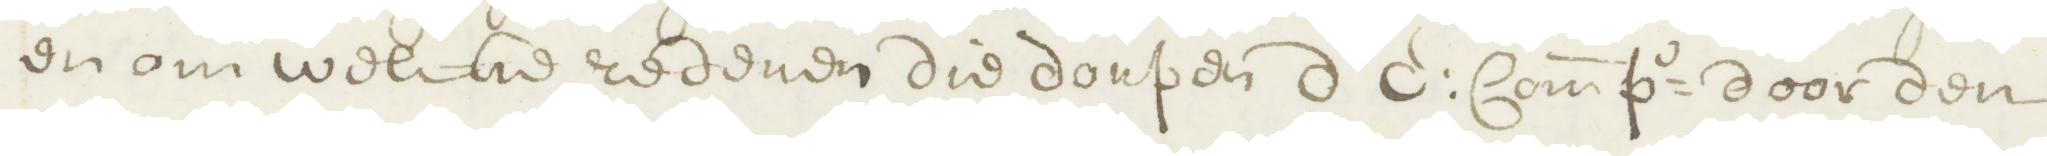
en om welcke redenen die dorpen d' E: Comp=s door den
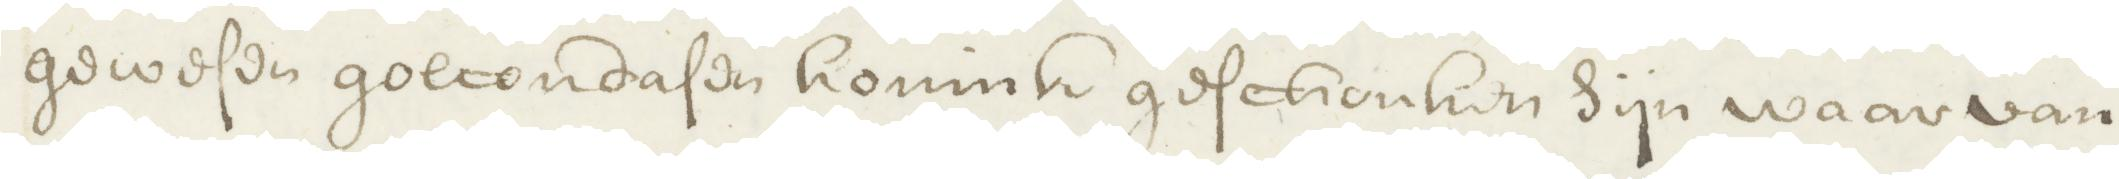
gewesen golcondasen konink geschonken sijn waar van
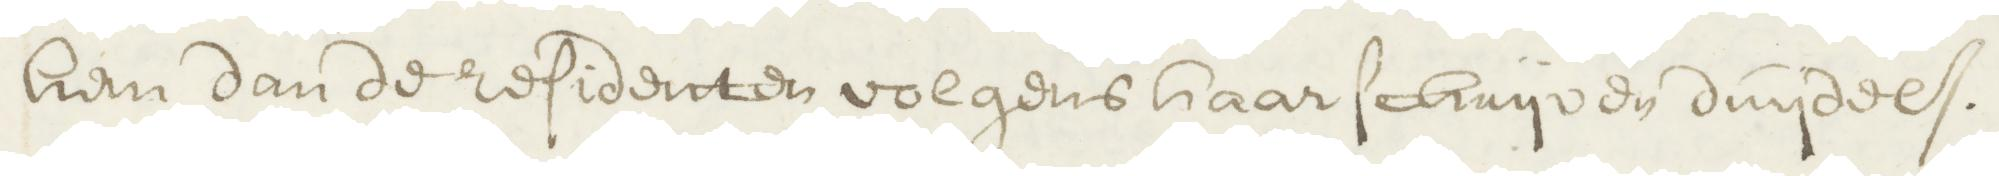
hem dan de residenten volgens haar schrijven duijdelijk.
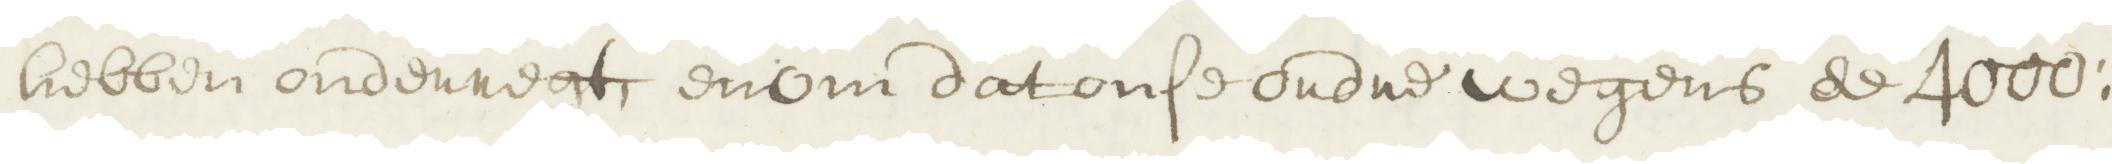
hebben onderregt, en om dat onse ordre wegens de 4000:
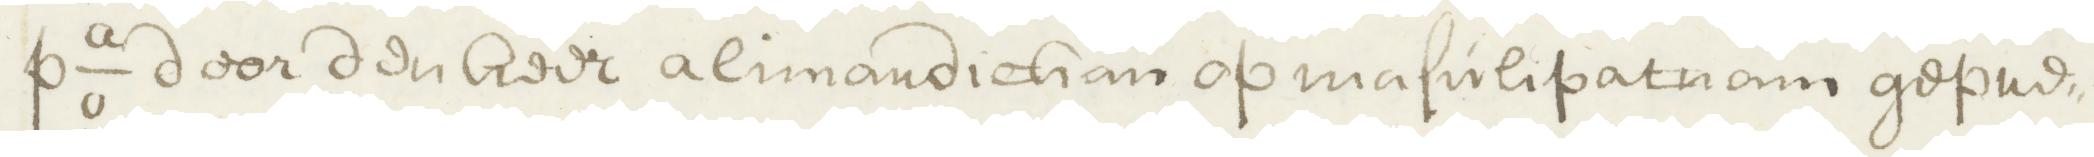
p a/o door den heer alimandichan op masulipatnam gepre„
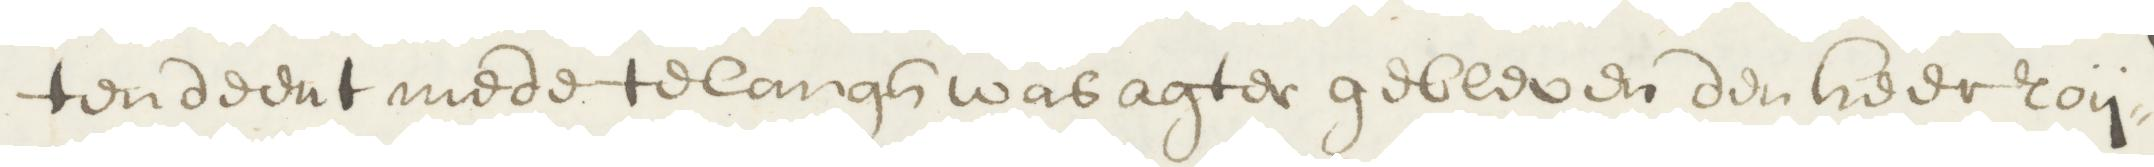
tendeert mede te langh was agter gebleven den heer roij„
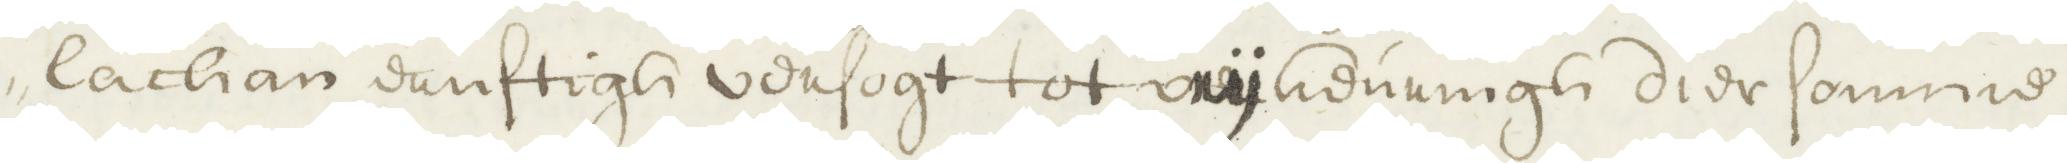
„lachan ernstigh versogt tot vrijkeuringh dier somme
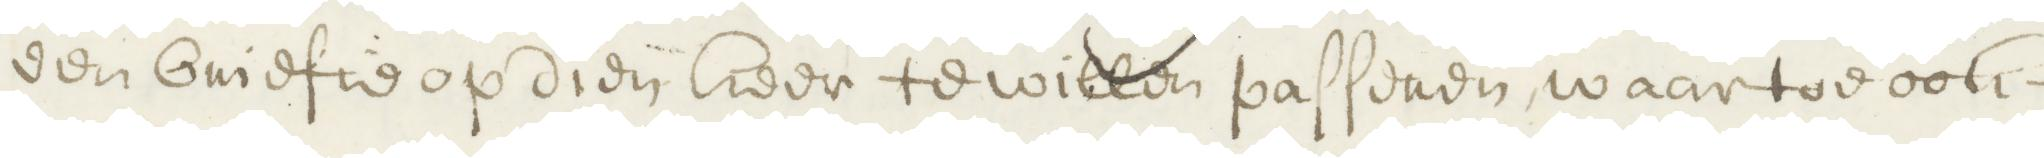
een briefie op dien heer te willen passeren, waar toe ook
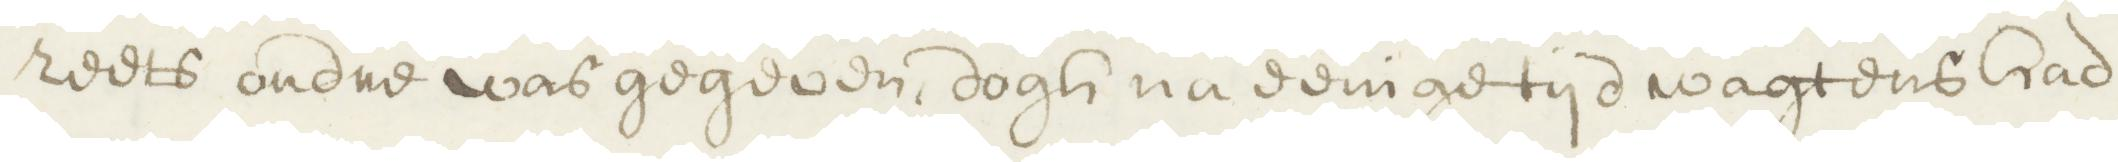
reets ordre was gegeven, dogh na eenige tijd wagtens had
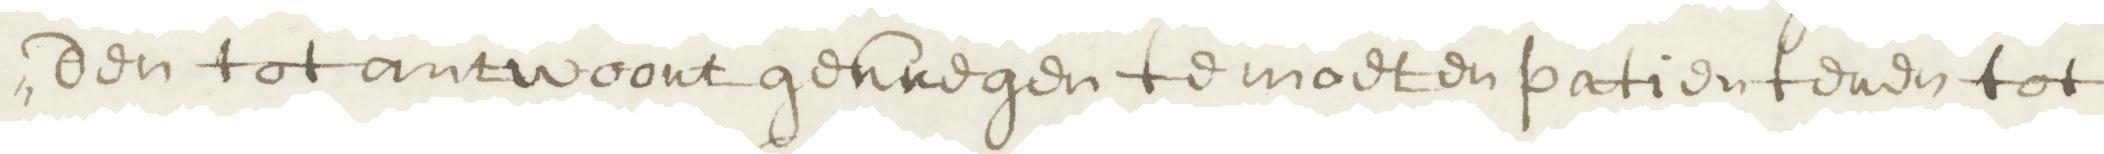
„den tot antwoort gekregen te moeten patienteren tot
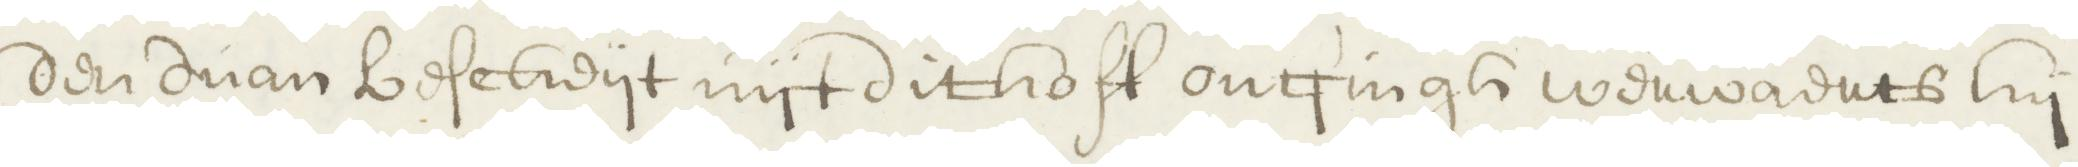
den duan bescheijt uijt dit hoff ontfingh werwaerts hij
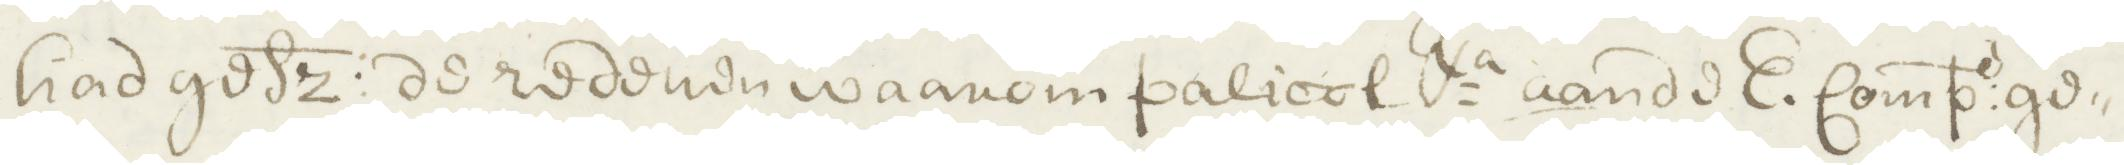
had gesz: de redenen waarom palicol &=a aan de E. Comp:s ge„
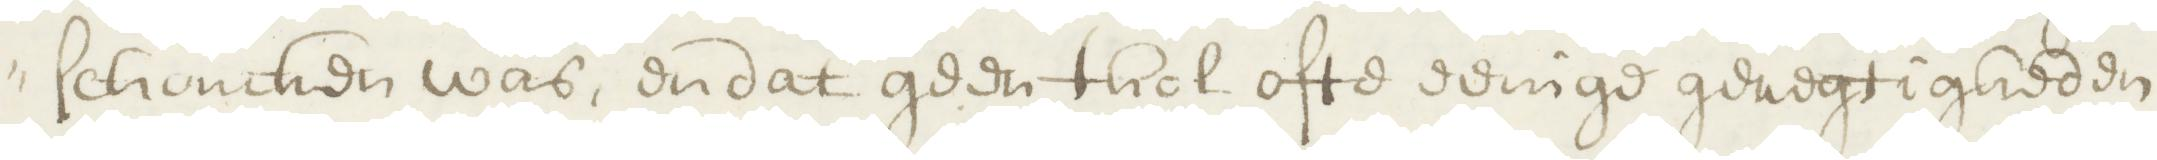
„schoncken was, en dat geen thol ofte eenige geregtigheden
